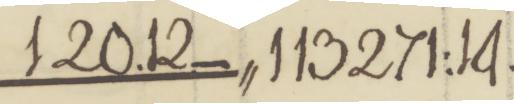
120.12—„113271:14
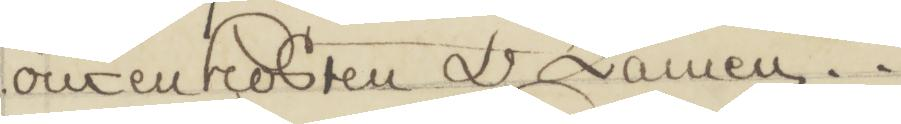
oncen kosten tezamen . .
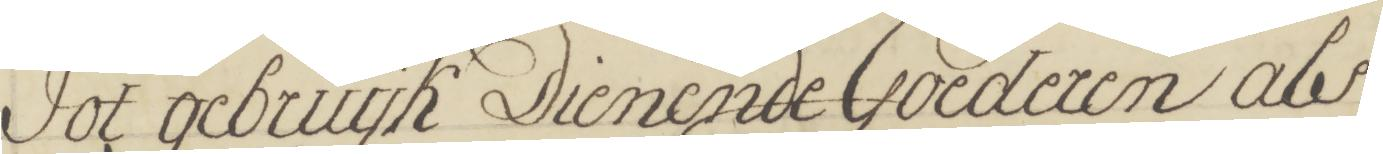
Tot gebruijk Dienende Goederen als;
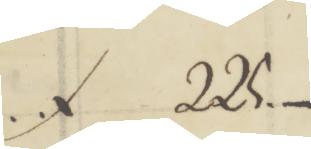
. .ƒ 225.—
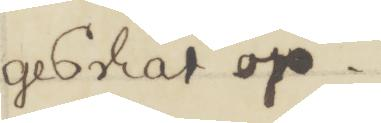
geschat op .
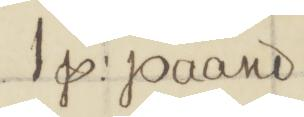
1 p:s paard
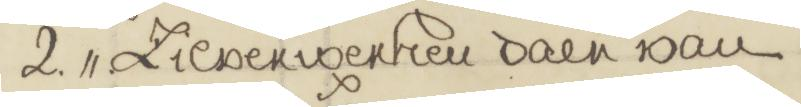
2. „ Zilverwerken daer van
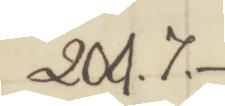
204.7.—
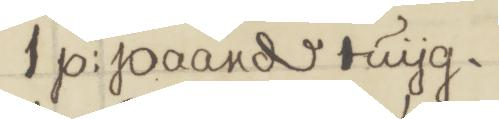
1 p:s paarde tuijg .
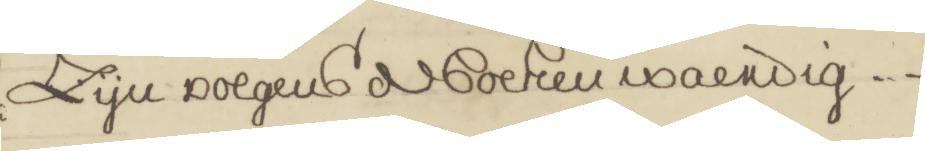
zijn volgens de boeken waerdig - -
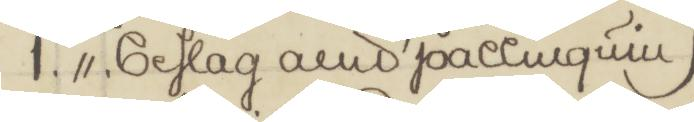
1. „ . beslag aen d’pallinquin
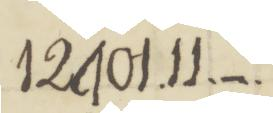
12401:11.–.
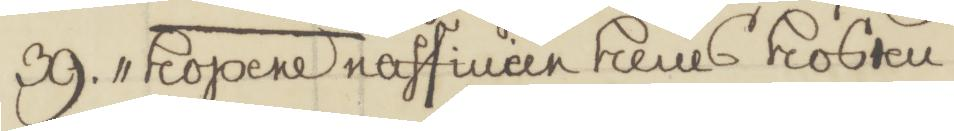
39. „ kopere raffineer ketels kosten
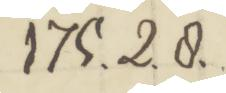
175.2.8.
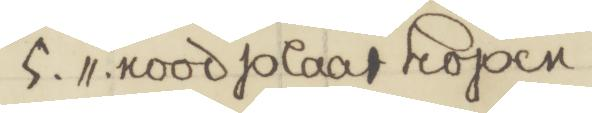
5. „ . rood plaat koper
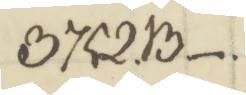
3752.13.—.
